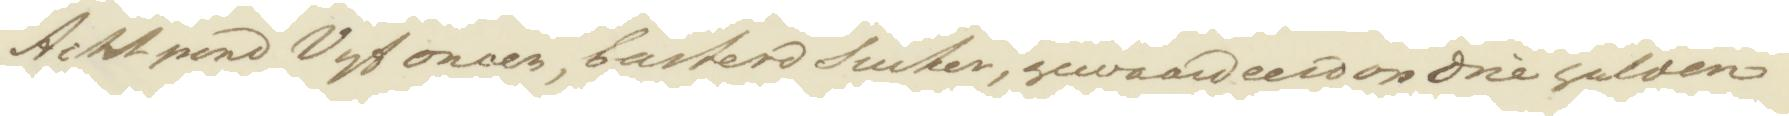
Acht pond Vyf oncen, basterd suiker, gewaardeerd op drie gulden
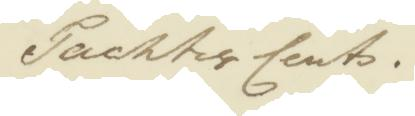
Tachtig Cents.
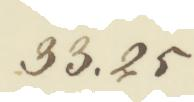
33.25
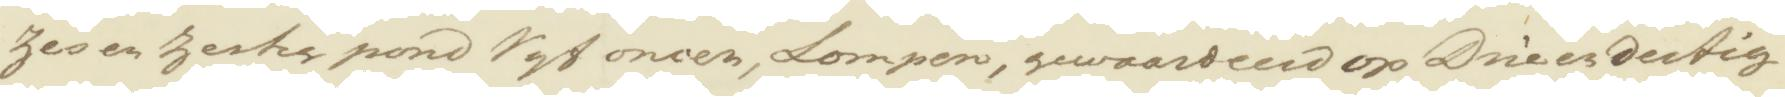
Zes en Zestig pond Vyf oncen, Lompen, gewaardeerd op Drie en dertig
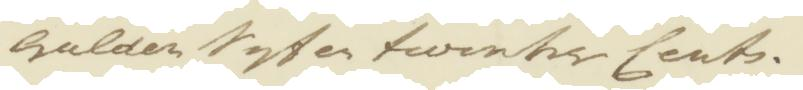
Gulden Vyf en twintig Cents.
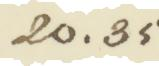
20. 35
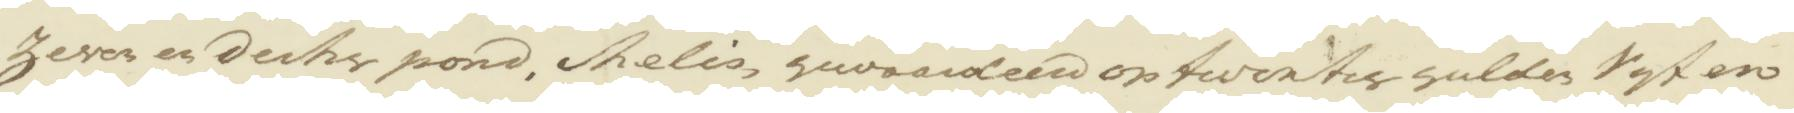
Zeven en dertig pond, Melis gewaardeerd op twintig gulden Vyf en
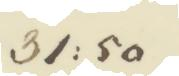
31:50
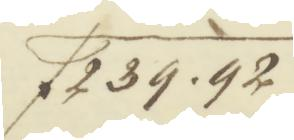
ƒ 239.92
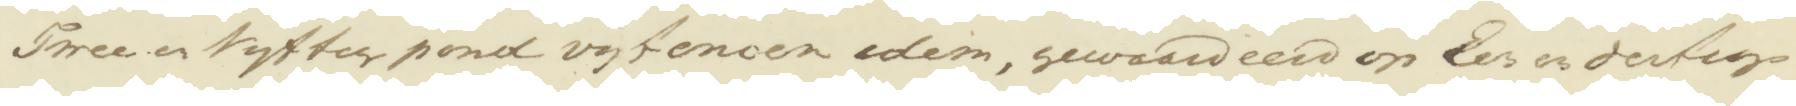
Twee en Vyftig pond vyf oncen idem, gewaardeerd op Een en dertig
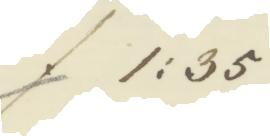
ƒ 1. 35
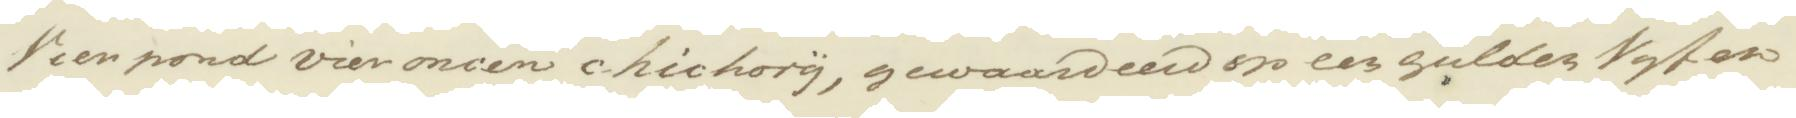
Vier pond vier oncen chichorij, gewaardeerd op een gulden Vyf en
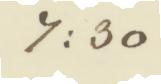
7: 30
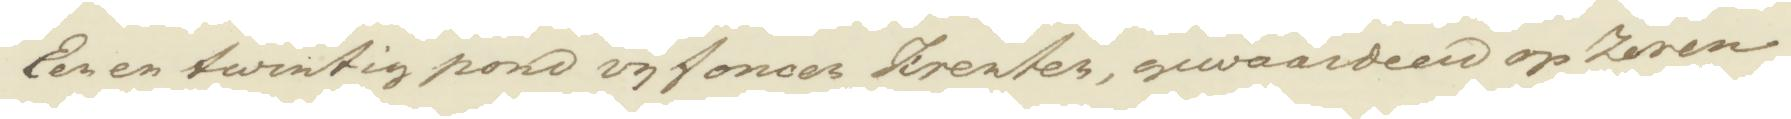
Een en twintig pond vyf oncen krenten, gewaardeerd op Zeven
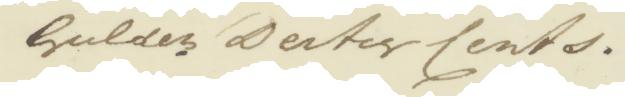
Gulden Dertig Cents.
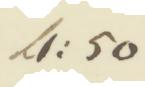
4: 50
